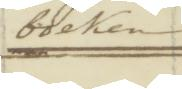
boeken
